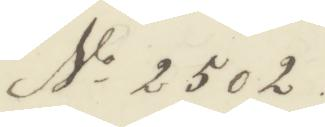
N:o 2502.
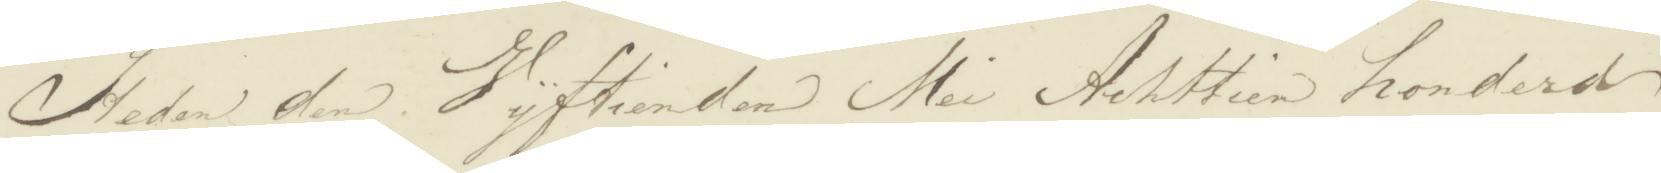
Heden den Vijftienden Mei Achttien honderd
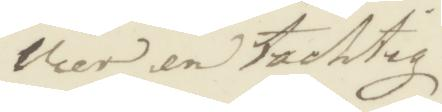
vier en tachtig.
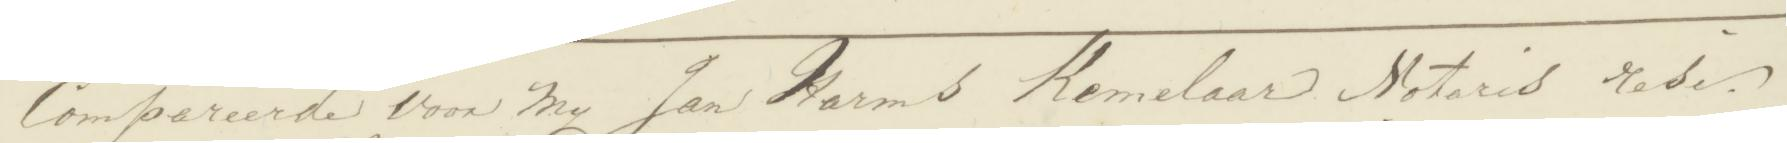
Compareerde voor my Jan Harms Kemelaar Notaris resi.
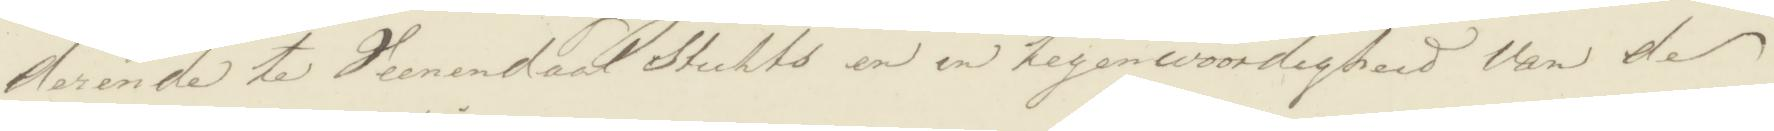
derende te Veenendaal Stichts en in tegenwoordigheid van de
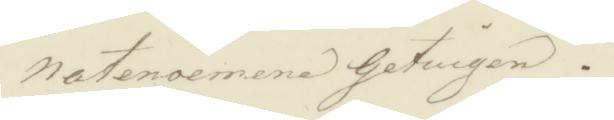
natenoemene Getuigen.
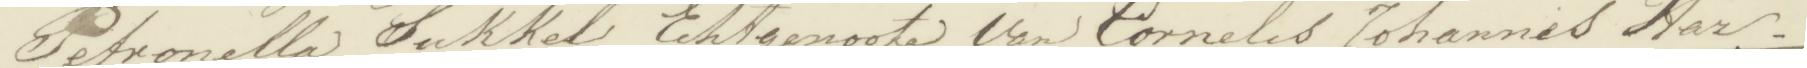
Petronella Sukkel Echtgenoote van Cornelis Johannes Har
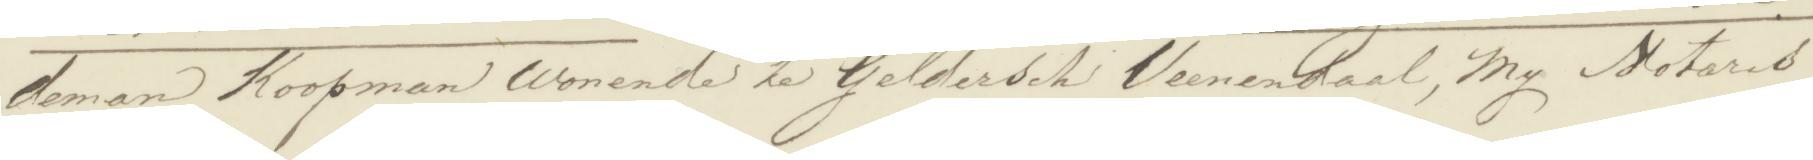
deman Koopman wonende te Geldersch Veenendaal, My Notaris
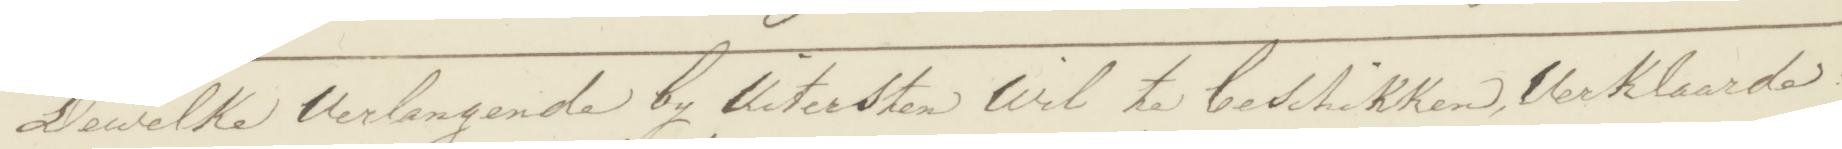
Dewelke Verlangende bij Uitersten wil te beschikken Verklaarde
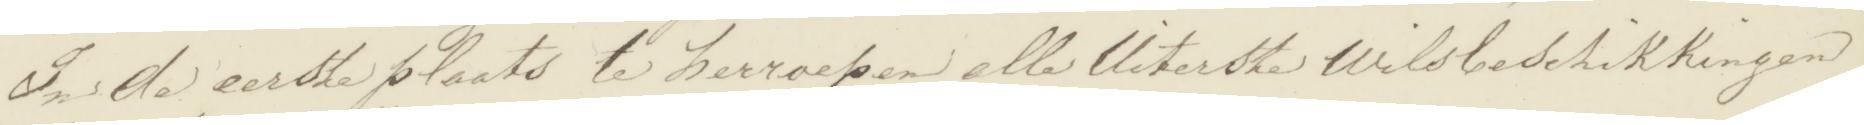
In de eerste plaats te herroepen alle Uiterste Wilsbeschikkingen
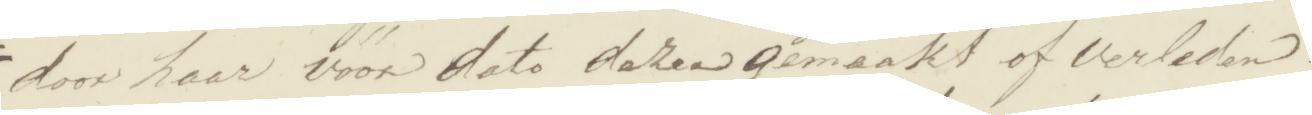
door haar voor dato dezer gemaakt of verleden.
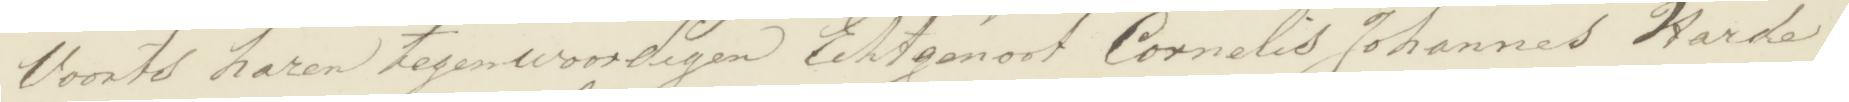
Voorts haren tegenwoordigen Echtgenoot Cornelis Johannes Harde-
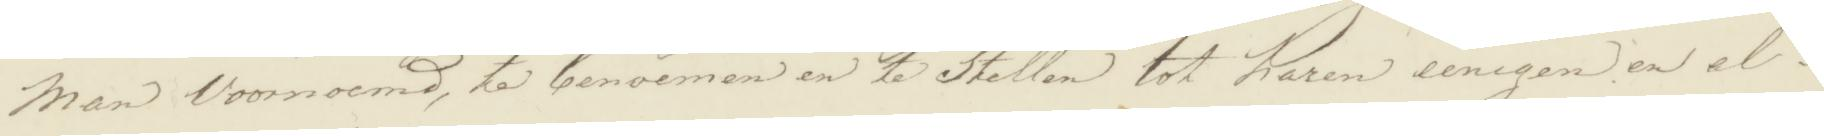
man voornoemd, te benoemen en te stellen tot haren eenigen en al„
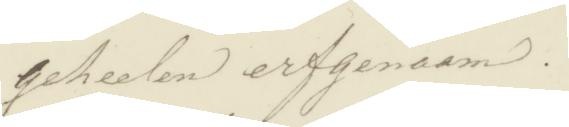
geheelen erfgenaam.
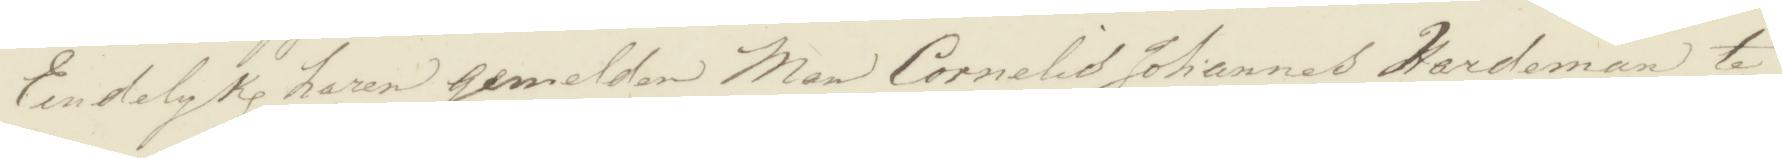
Eendelyk haren gemelden Man Cornelis Johannes Hardeman te
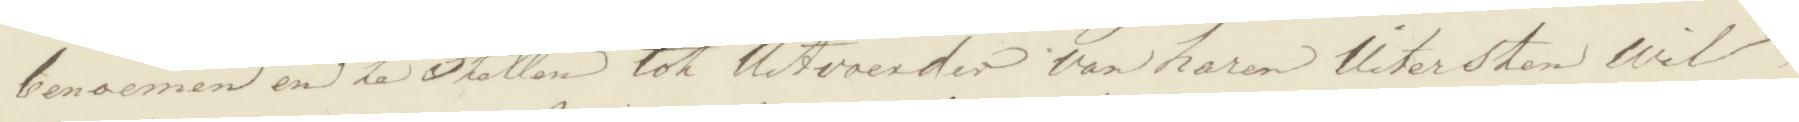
benoemen en te Stellen tot Uitvoerder van haren Uitersten Wil
